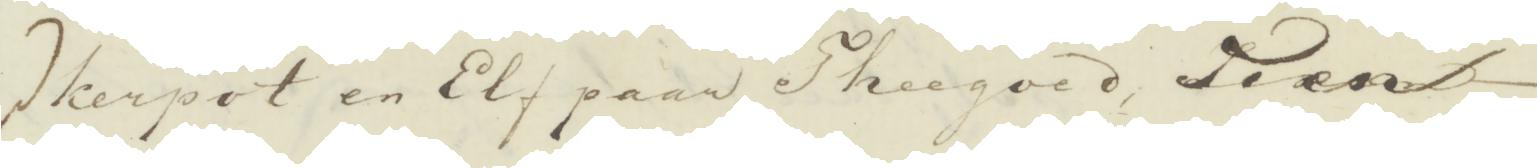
kerpot en Elf paar Theegoed, Tien
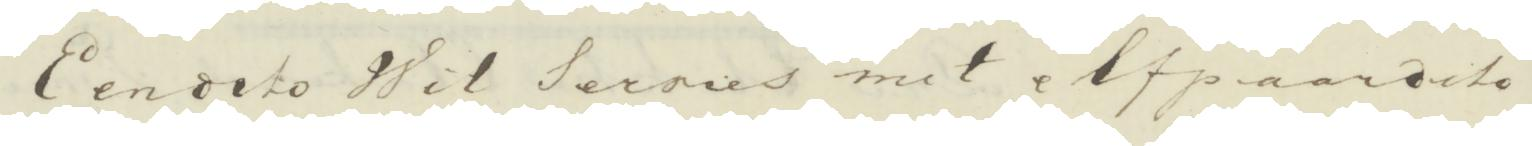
Een dito Wit Servies met elfpaardito
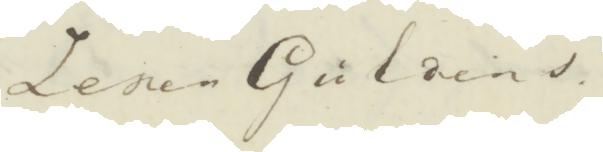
Zeven Guldens.
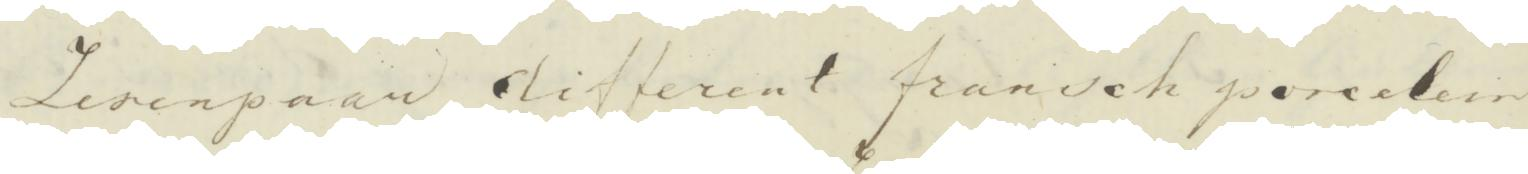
Zevenpaar different fransch porcelein
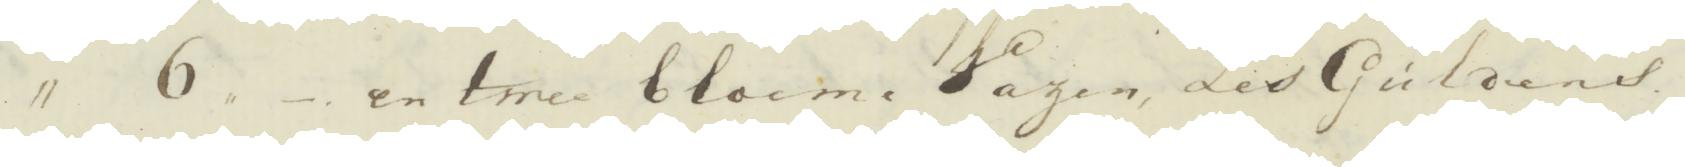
„ 6 „ -. en twee bloeme Vazen, Zes Guldens.
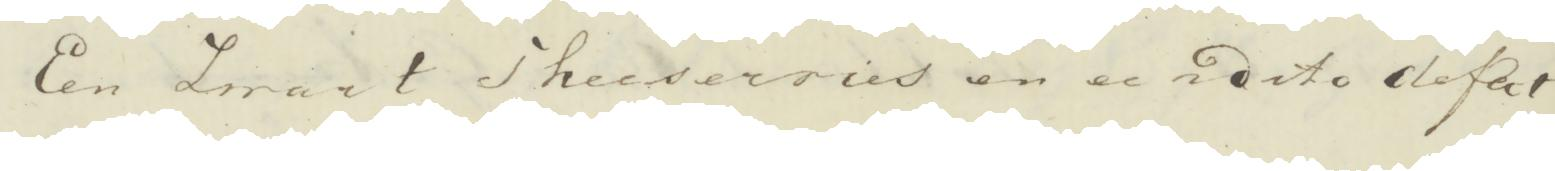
Een Zwart Theeservies en een dito defect
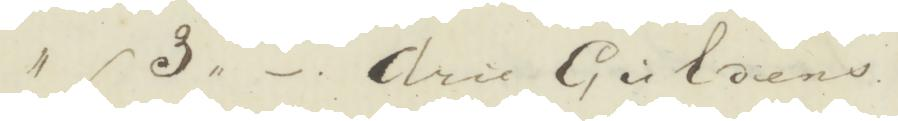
„ 3„ —. drie Guldens.
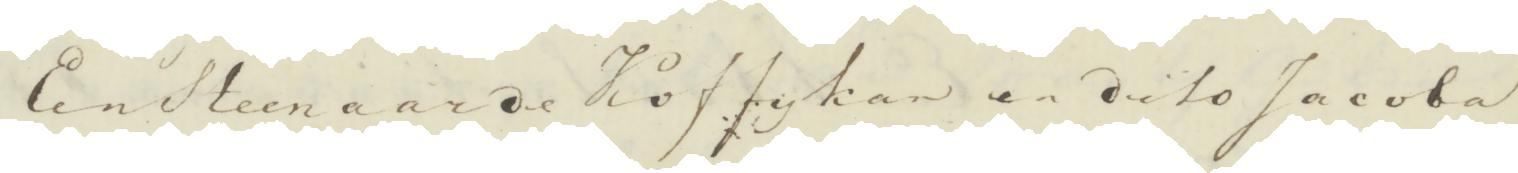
Een steenaarde Koffijkan en dito Jacoba
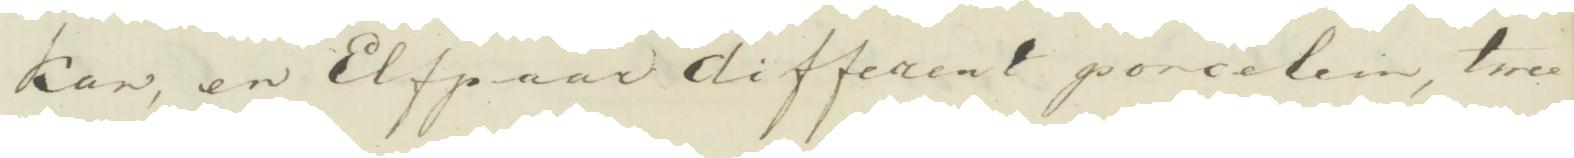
kan, en Elfpaar different porcelein, twee
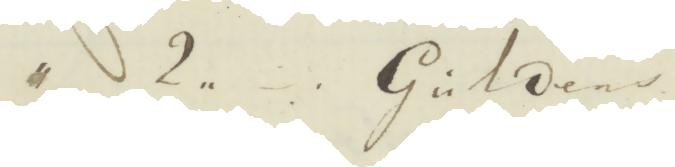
„ 2„ -. Guldens
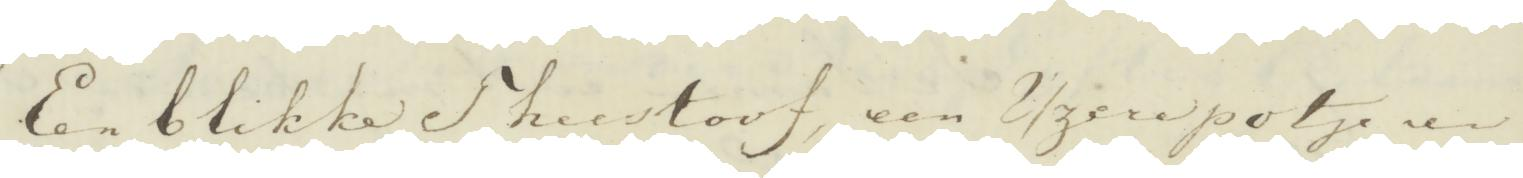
Een blikke Theestoof, een Yzere potje een
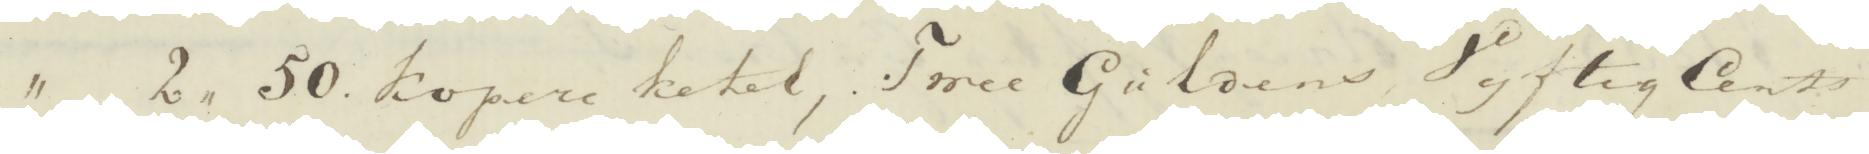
„ 2„ 50. kopere ketel, Twee Guldens, Vyftig Cents
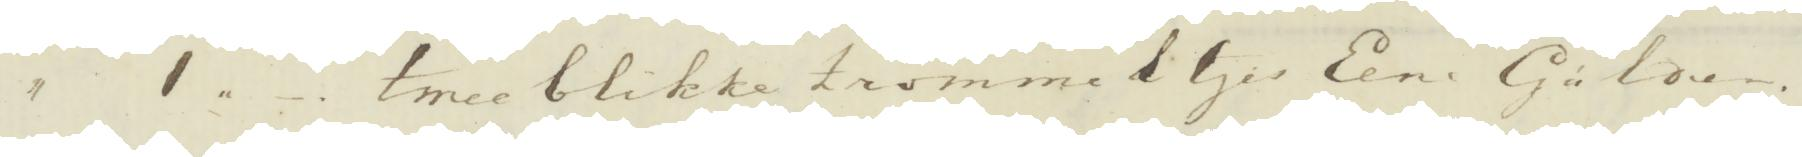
„1 „ -. twee blikke trommeltjes Eene Gulden.
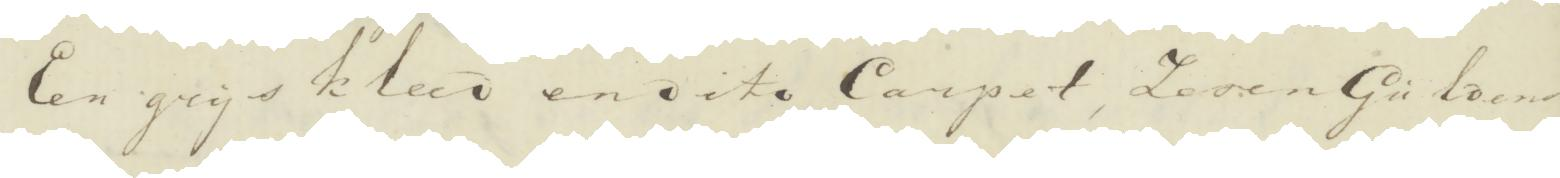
Een grijs kleed en dito Carpet, Zeven Guldens
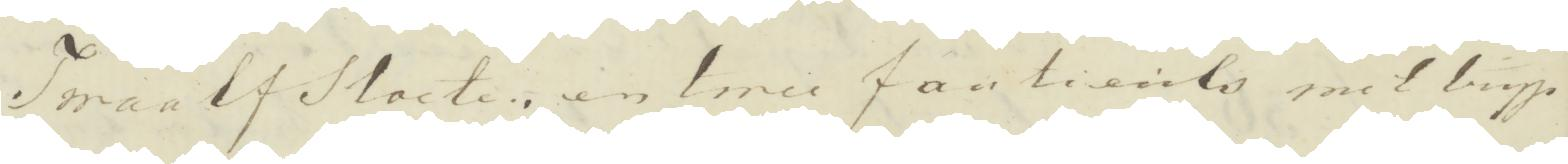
Twaalf Sloeten en twee fautieuls met trijp
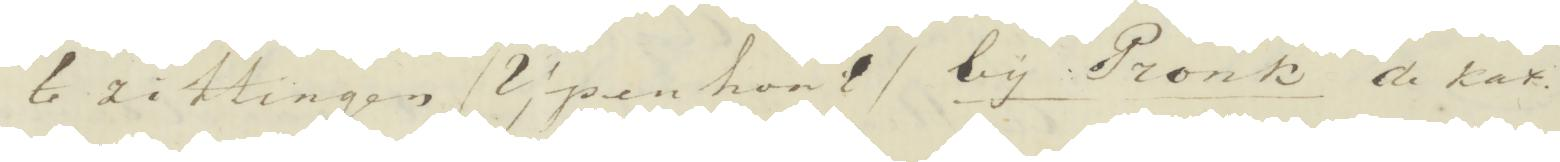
te zittingen /Ypenhout/ bij Pronk de kat.
